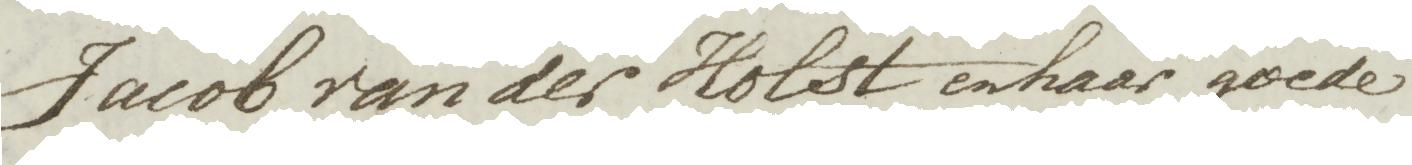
Jacob van der Holst, en haar goede
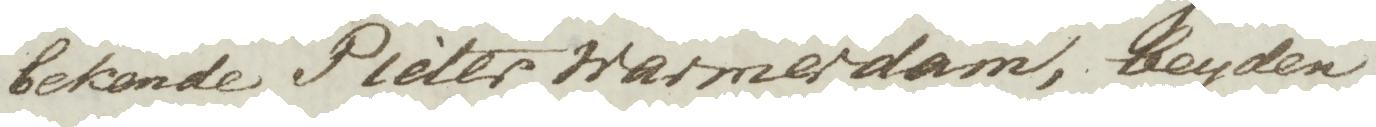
bekende Pieter Warmerdam, beyden
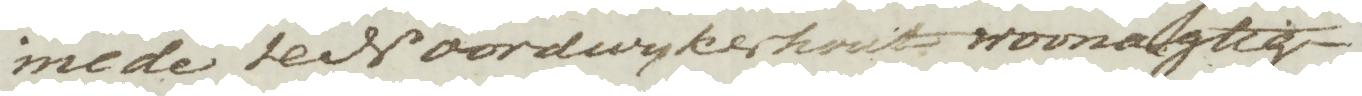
mede te Noordwykerhout woonagtig
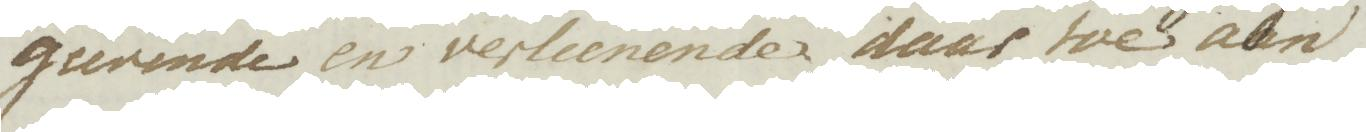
geevende en verleenende daar toe aan
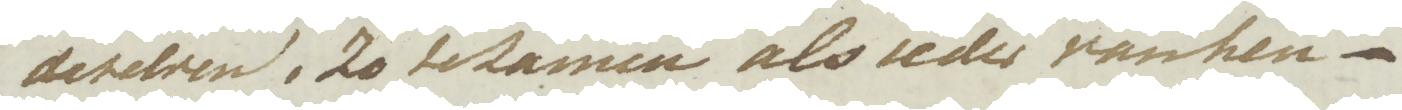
dezelven, zo tezamen als ieder van hen-
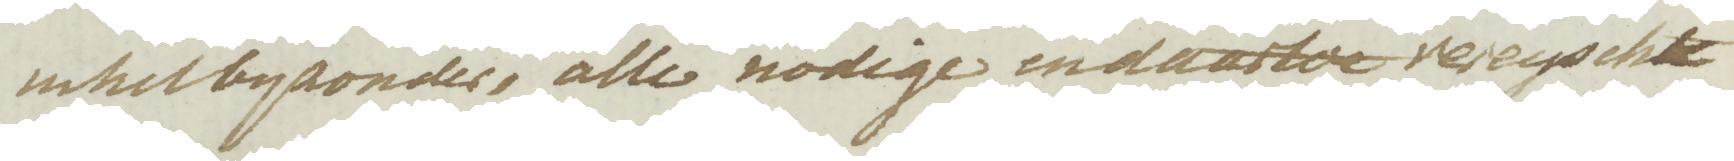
in het byzonder, alle nodige en daar toe vereyschte
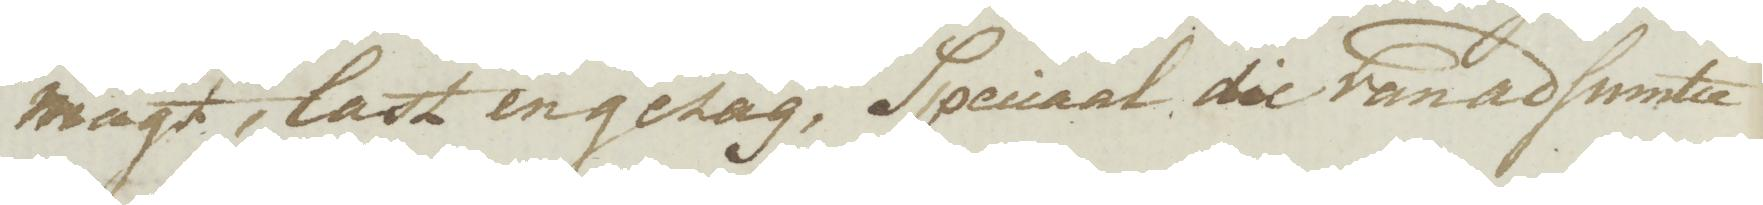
magt, last en gezag, Speciaal die van adsumtie
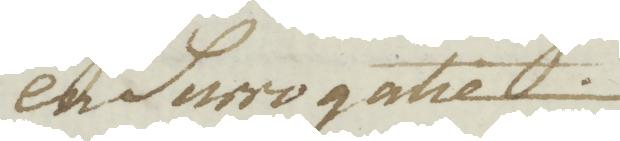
en Surrogatie.
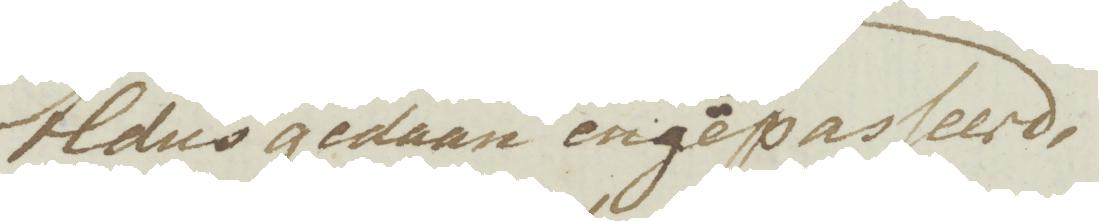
Aldus gedaan en gepasseerd,
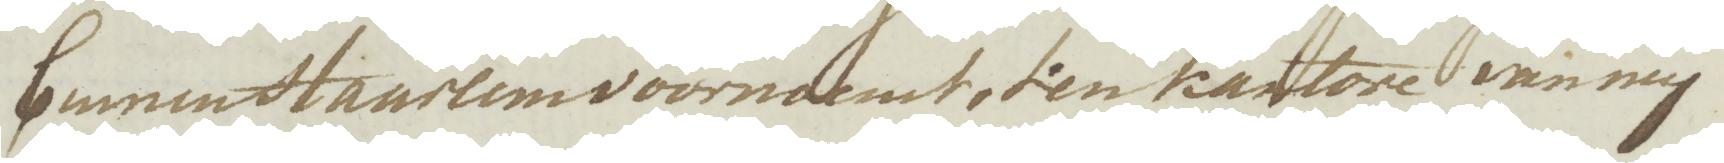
binnen Haarlem voornoemt, ten kantore van my
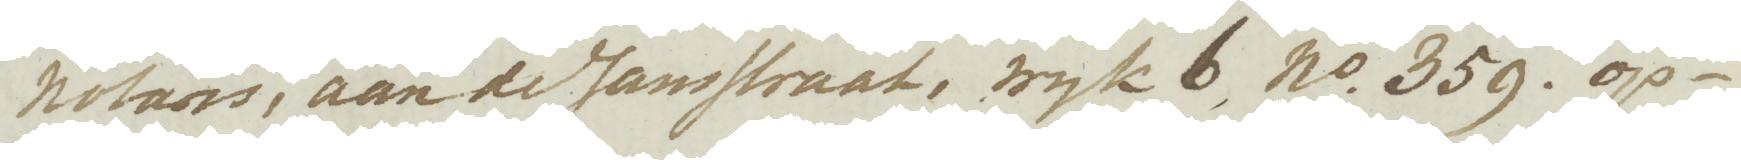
Notaris, aan de Jansstraat, wijk 6, N.o. 359. op-
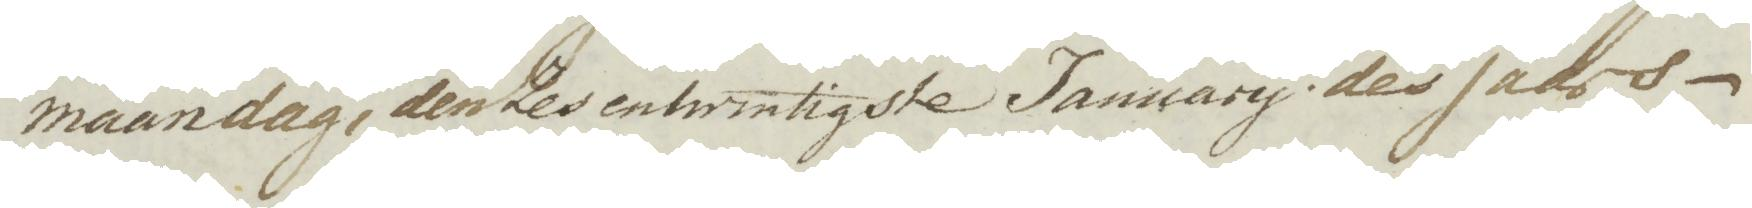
maandag, den Zes entwintigste Ianuary des jaars -
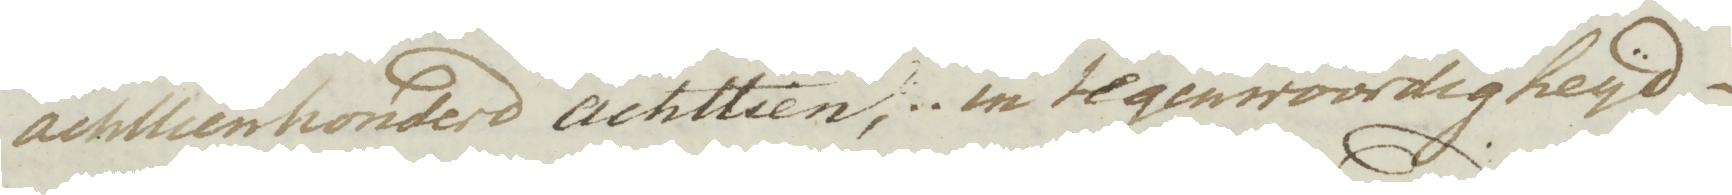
achttienhonderd achttien, . . in tegenwoordigheijd -
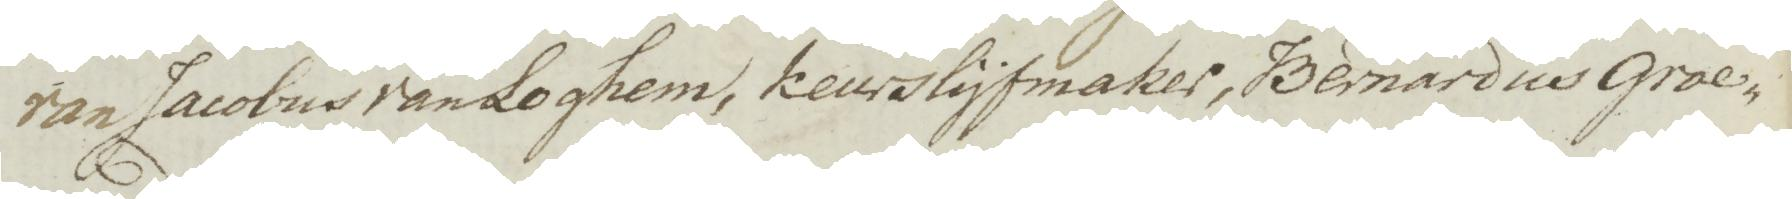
van Jacobus van Loghem, keurslijfmaker, Bernardus Groe„
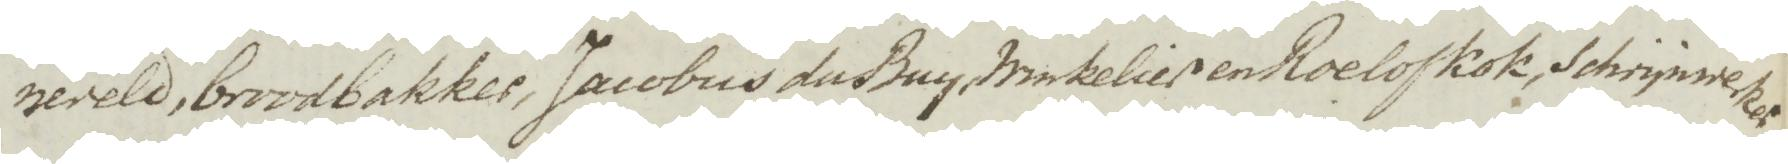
neveld, broodbakker, Jacobus du Buy, Winkelier en Roelof Kok, schrijnwerker,
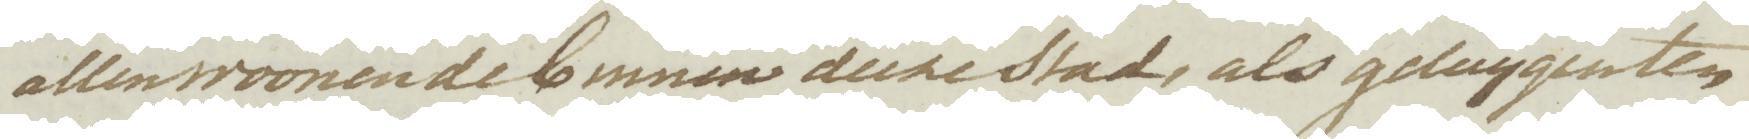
allen woonende binnen deeze Stad, als getuygen ten
